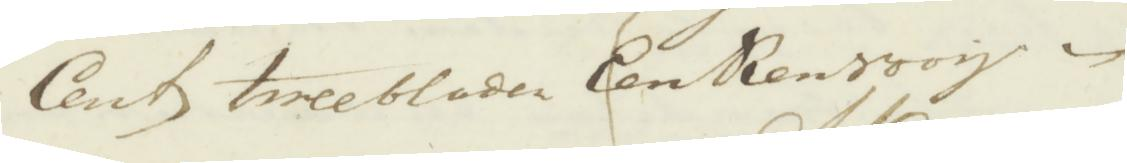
Cent twee bladen Een Renvooy —
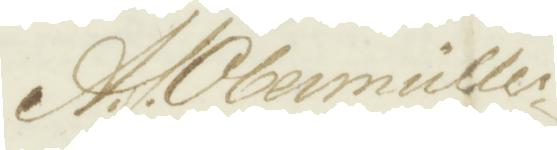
A.F. Obermüller
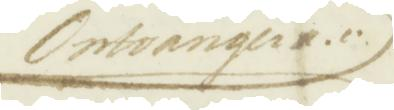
Ontvanger
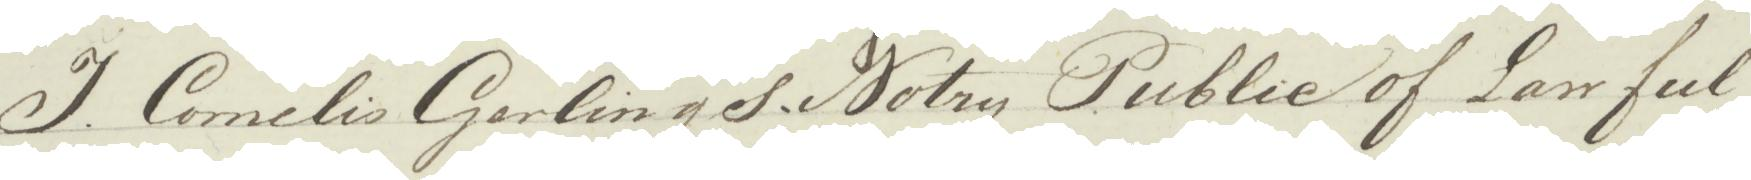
I. Cornelis Gerlings Notry Public of Lawful
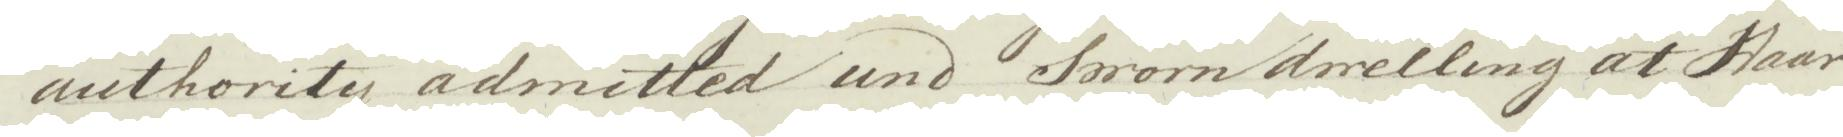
authority admitted and sworn dwelling at Haar
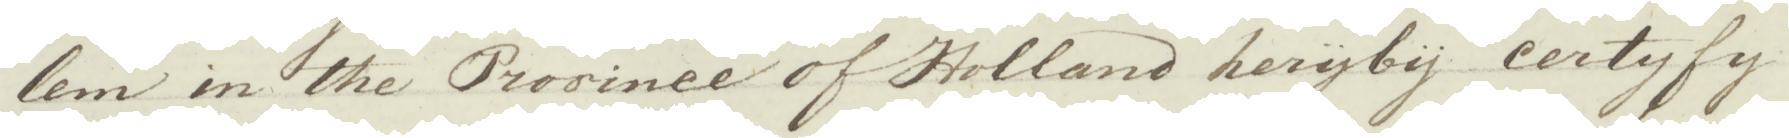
lem in the Province of Holland herijbij certyfy
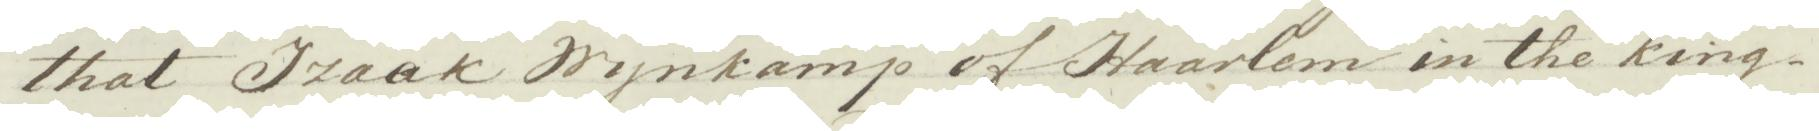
that Izaak Wynkamp of Haarlem in the king-
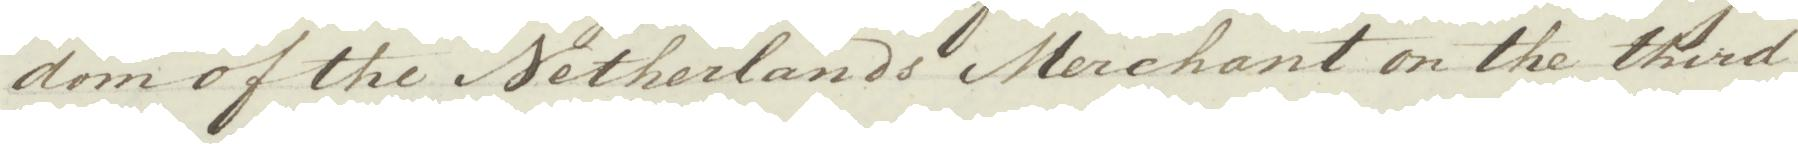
dom of the Netherlands Merchant on the third
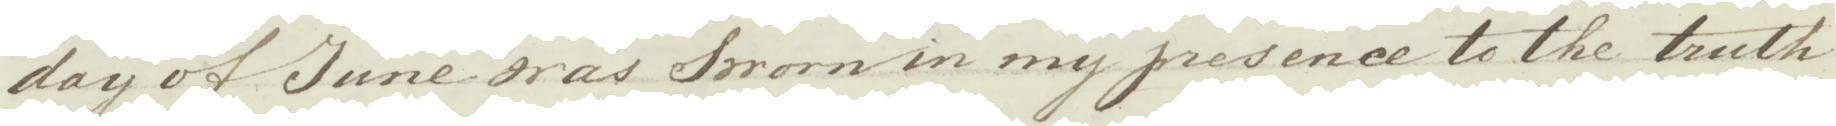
day of Iune was sworn in my presence to the truth
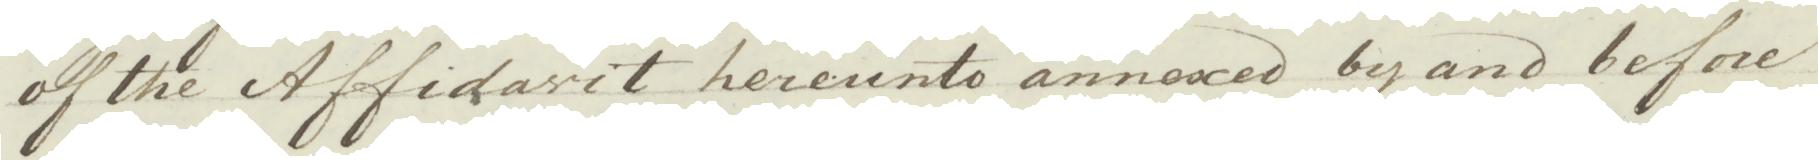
of the Affidavit hereunto annexed by and before
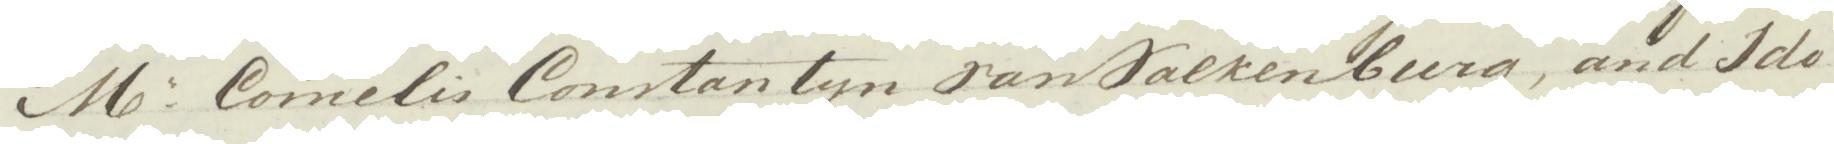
M: Cornelis Constantyn van Valkenburg, and Ido
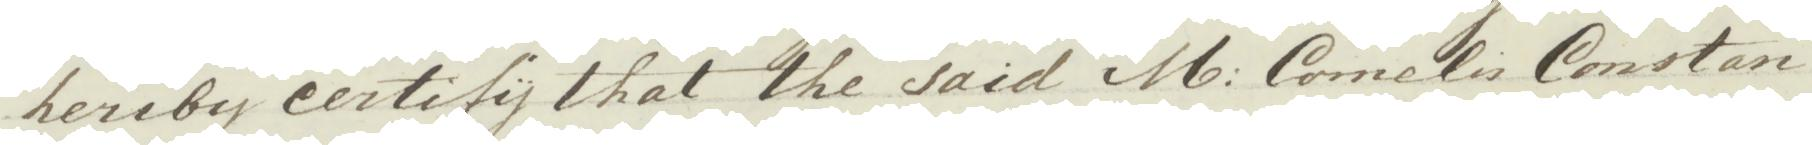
hereby certify that the said M: Cornelis Constan
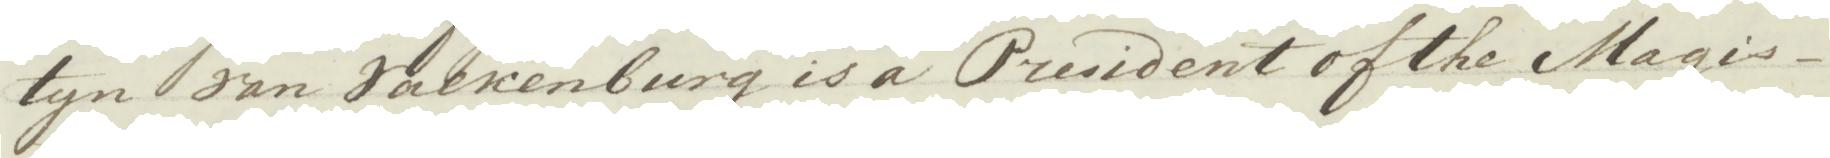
tyn van Valkenburg is a President of the Magis-
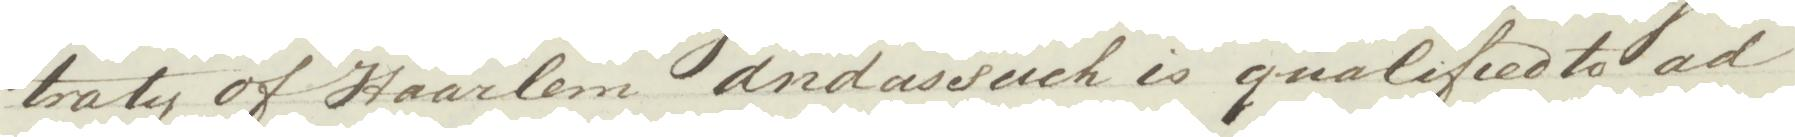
traty of Haarlem and as such is qualified to ad
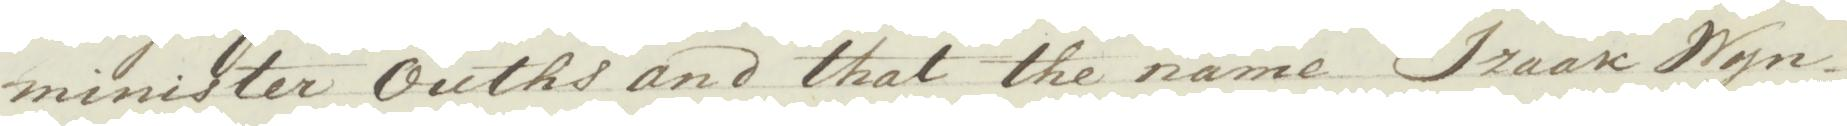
minister Ouths and that the name Izaak Wyn
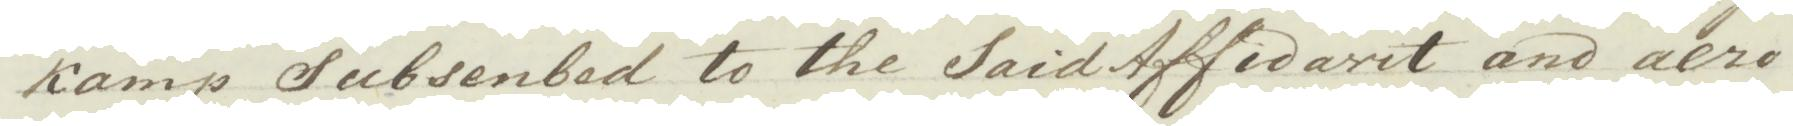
kamp subsenbed to the said Affidavit and alzo
